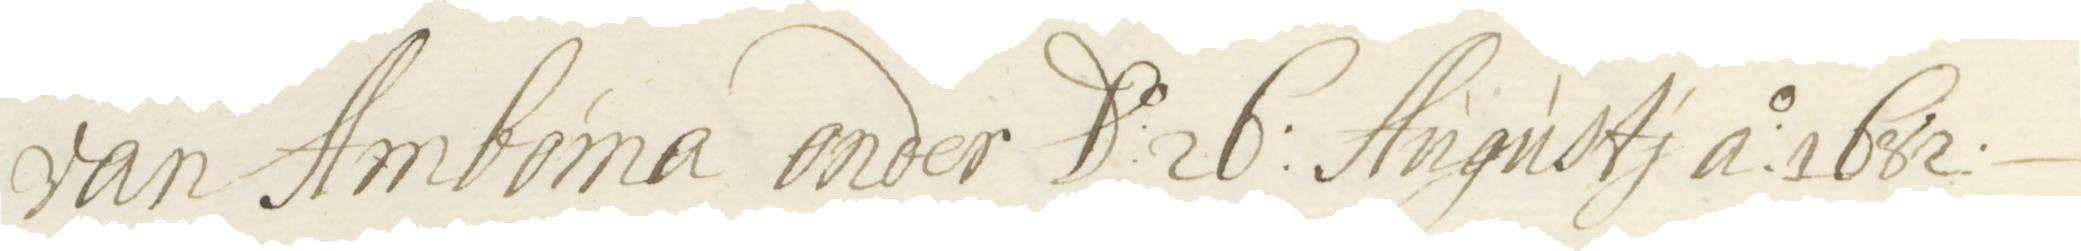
van Amboina onder D:o 26: Augustj a:o 1682: —
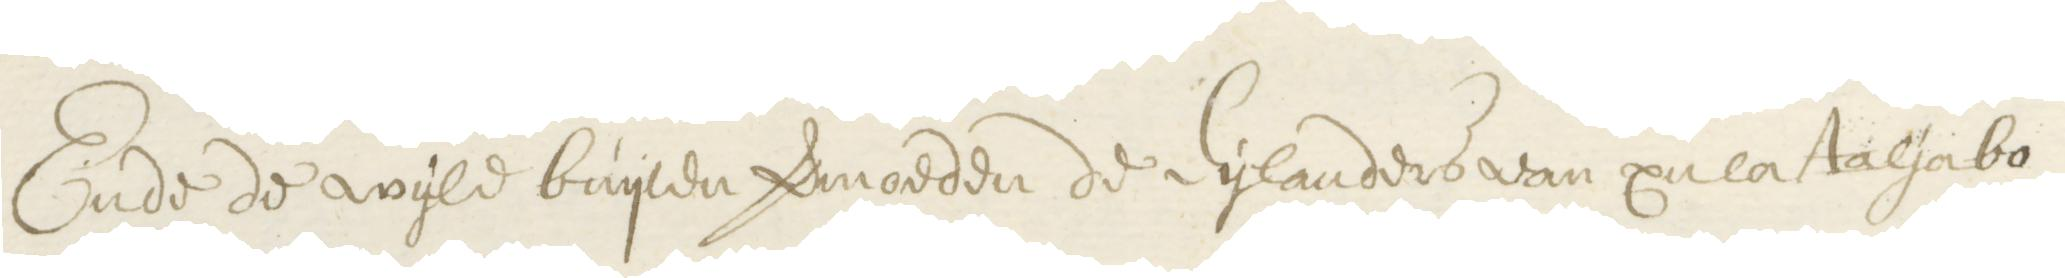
Ende de wijle buijten vermoeden de Eijlanders van xulataljabo
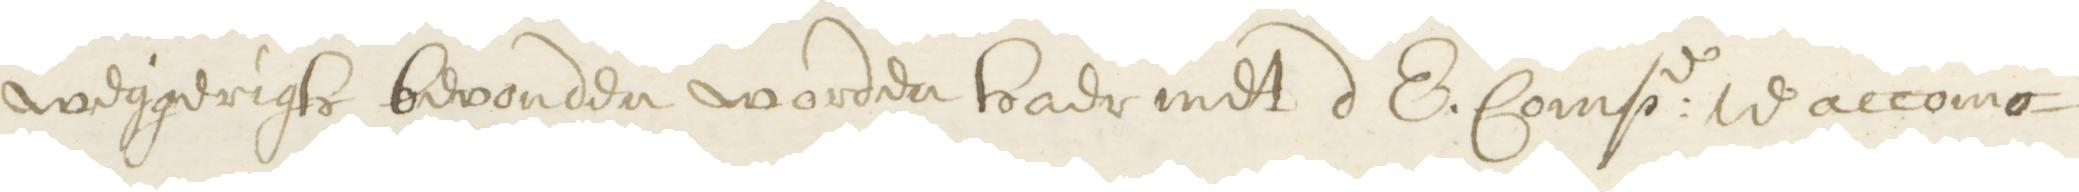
weijgerigh bevonden worden haer met d'E. Comp:e te accomo„
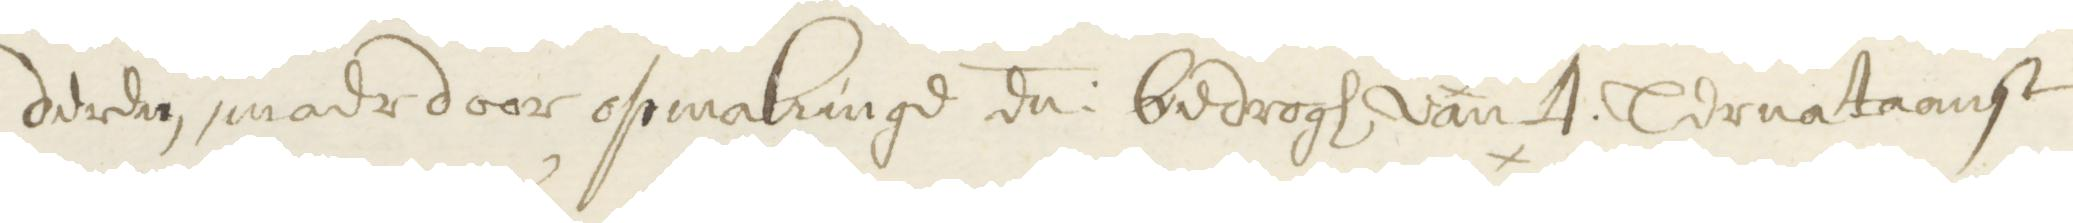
deren, maer door opmakinge en: bedrogh van 3: â 4. Ternataanst
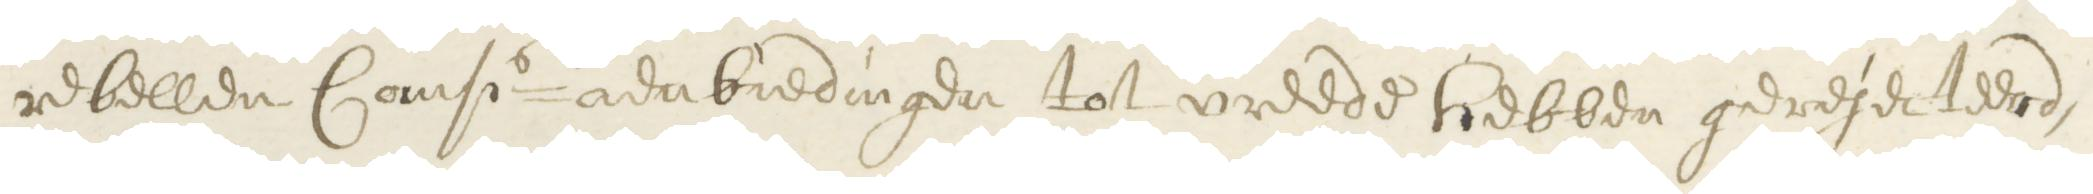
rebellen Comp=s aenbiedingen tot vreede hebben gerejecteerd,
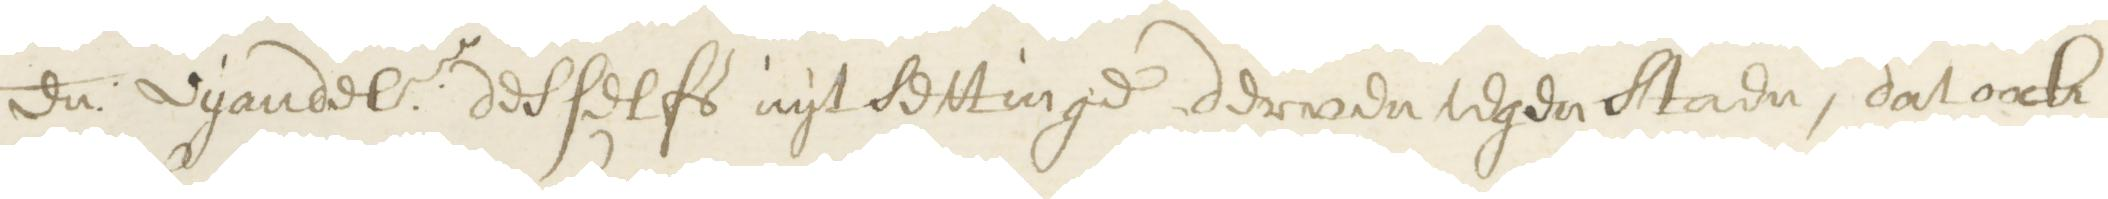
en: vijandel: desselfs uijtsettinge derwen tegen staen, dat oock
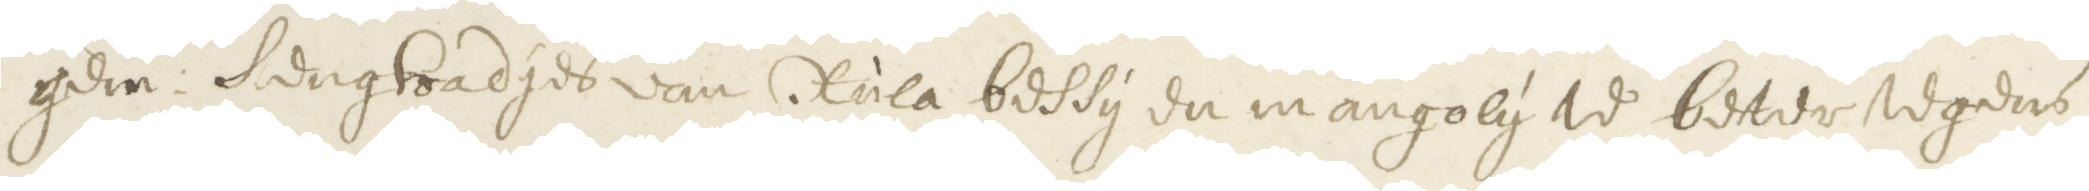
gem: senghadjes van Xula bessij en mangolij te beter tegens
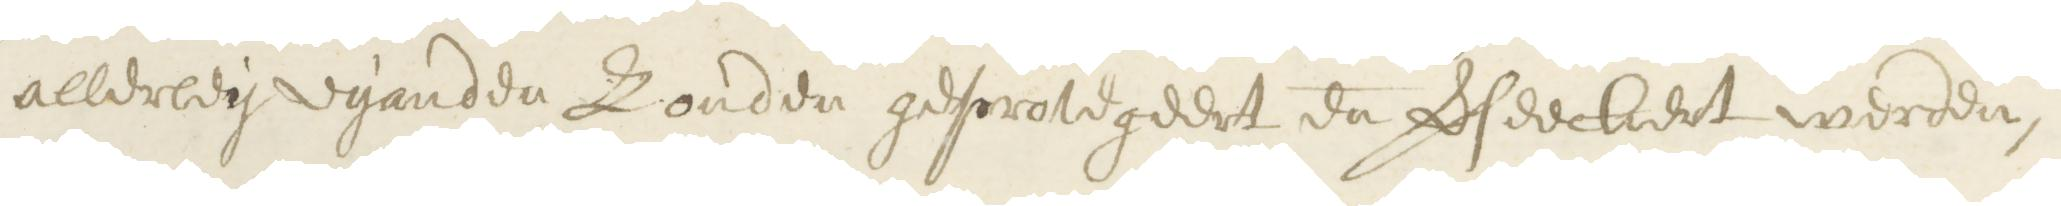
allerleij vijanden zouden geprotegeert en verseeckert werden,
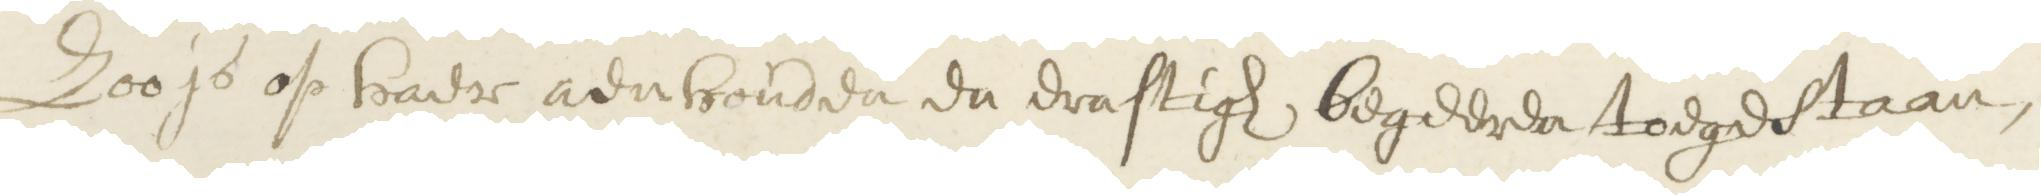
zoo js op haer aenhouden en erastigh begeeren toegestaan,
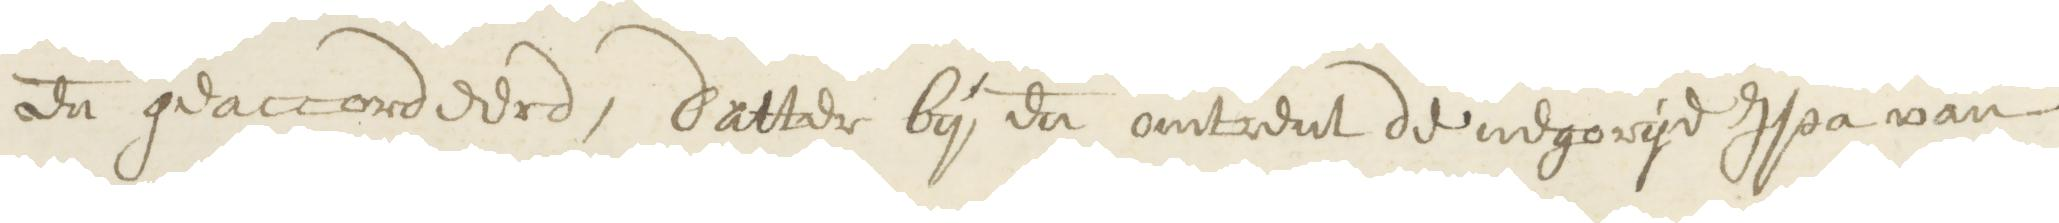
en geaccordeerd, datter bij en omtrent de negorije Jpa van
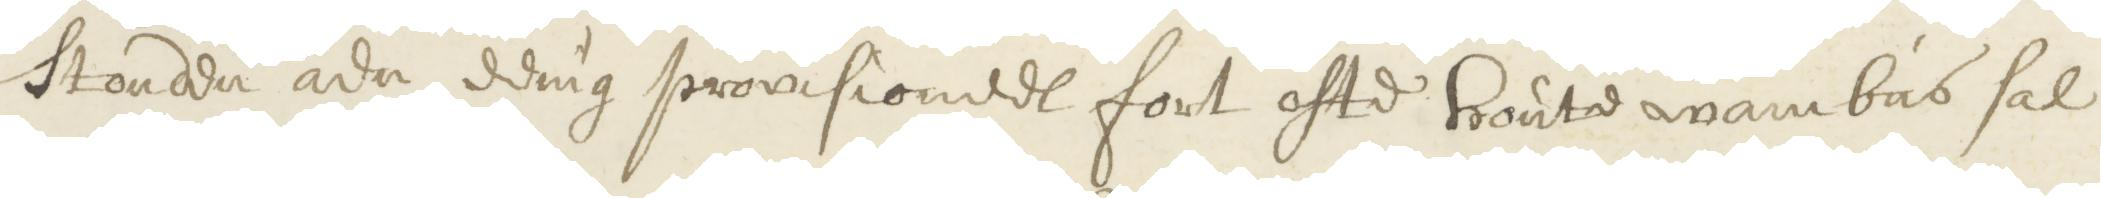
stonden aen eenig provisioneel fort ofte houte wambus sal
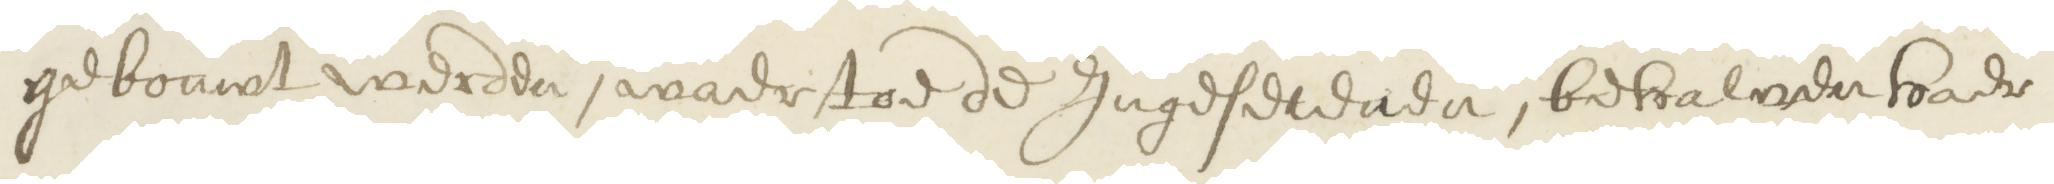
gebouwt werden, waer toe de Jngesetenen, behalven haer
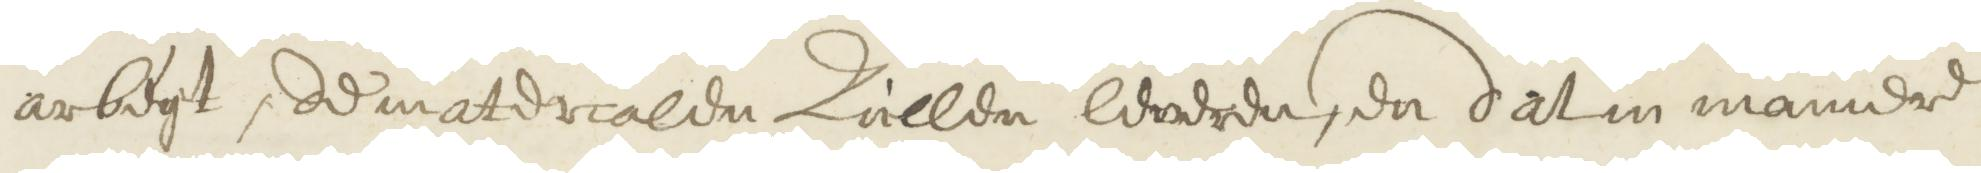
arbeijt, de materialen zullen leveren, en dat in maniere
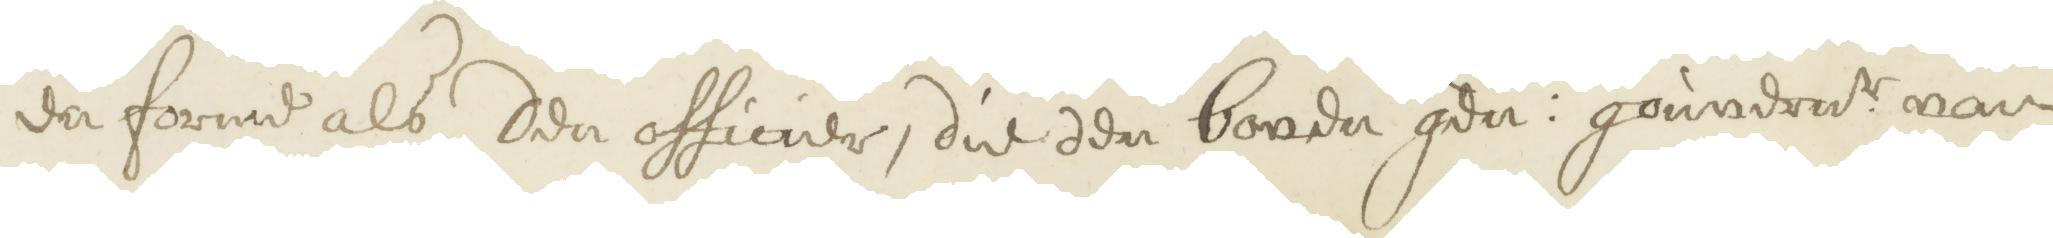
en forme als den officier, die den boven gen:e gouvern:r van
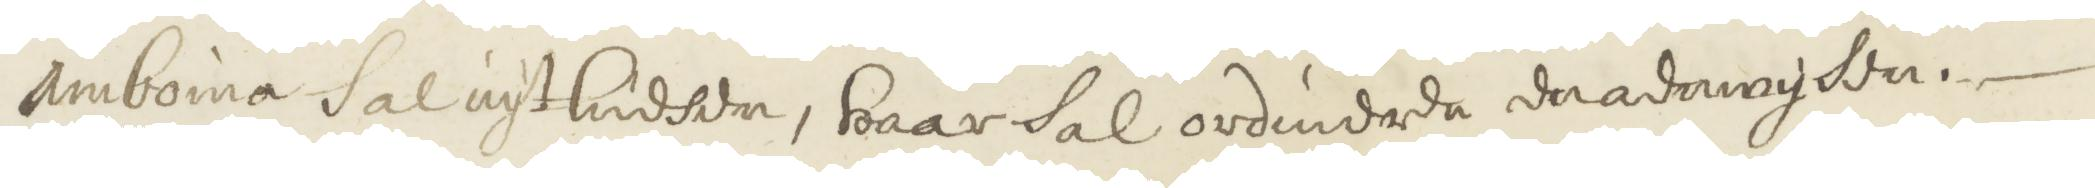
Amboina sal uijtkiesen, haar sal ordineren en aenwijsen. —
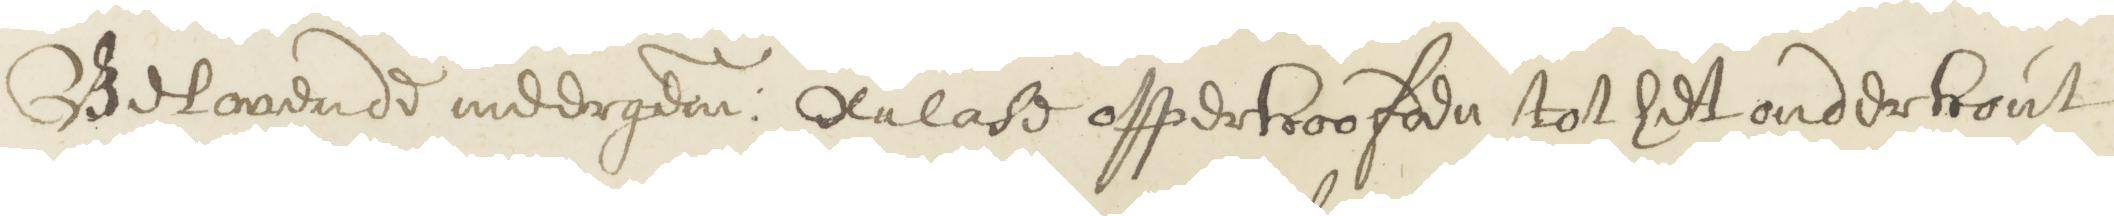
Belovende meergem:e Xulase opperhoofden tot het onderhout
